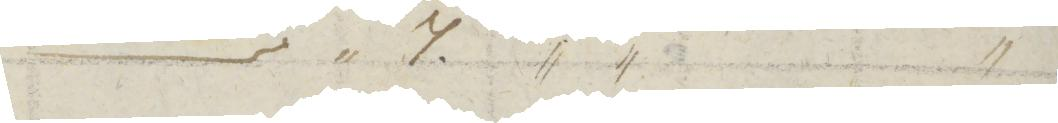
— „ 7. „ „ „
